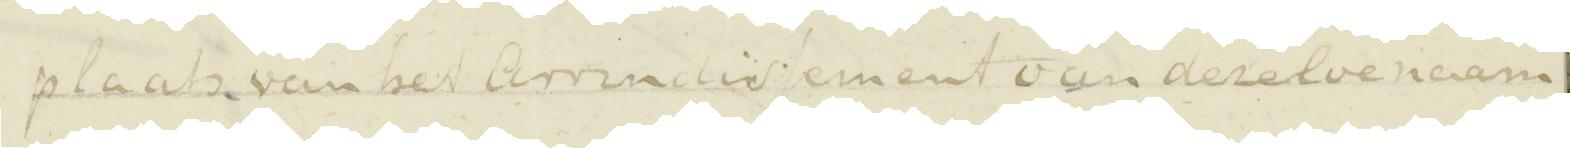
plaats van het Arrondissement van dezelve naam
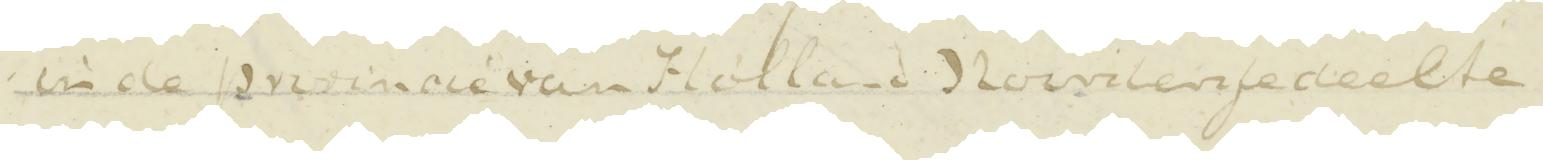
in de provincie van Holland Noordergedeelte
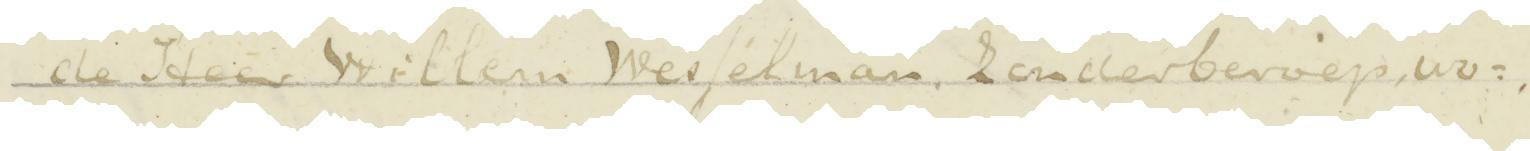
de Heer Willem Wesselman, zonderbevoep, wo=
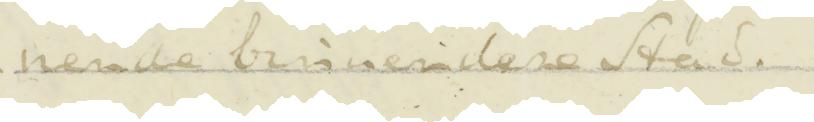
nende binnen deze stad.
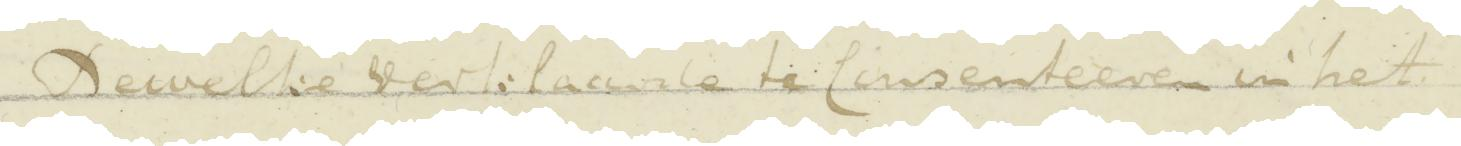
Dewelke verklaarde te Consenteeren in het
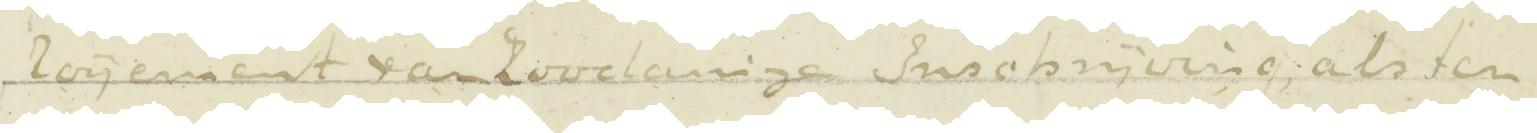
roijement van zoodanige Jnschrijving; als ten
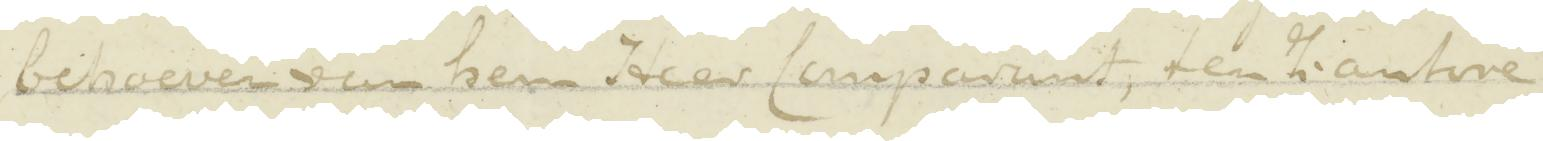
behoeven van hem Heer Comparant; ten kantore
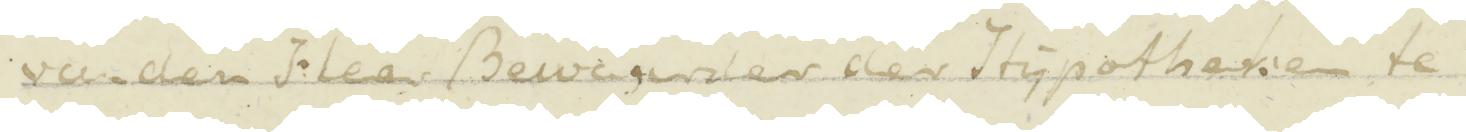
van den Heer Bewaarder der Hijpotheken te
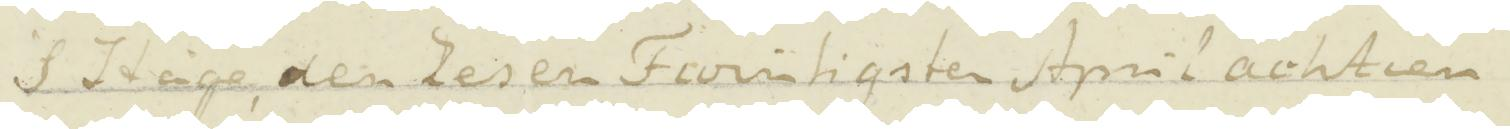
's Hage, den zes en Twintigsten April achtien
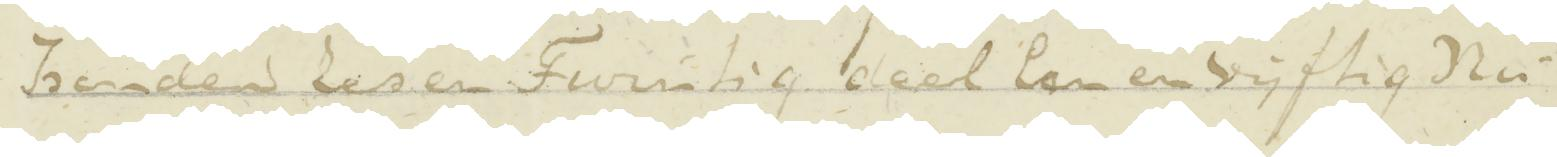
honderd zes en Twintig deel Een en vijftig Nu
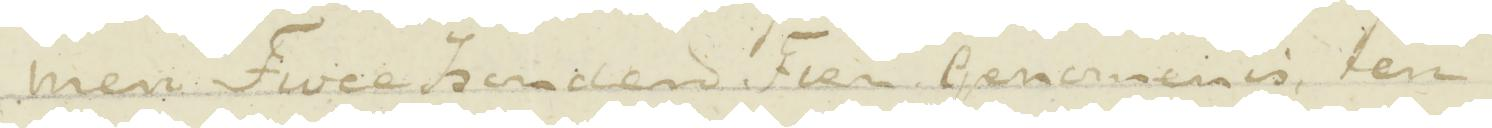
mero Twee Honderd Tien. Genomen is, ten
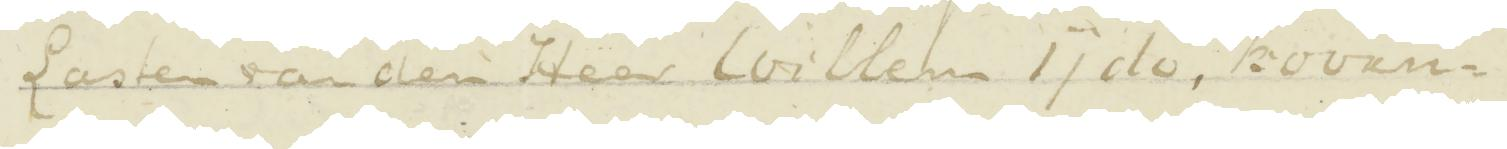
Lasten van den Heer Willem IJdo, koorn=
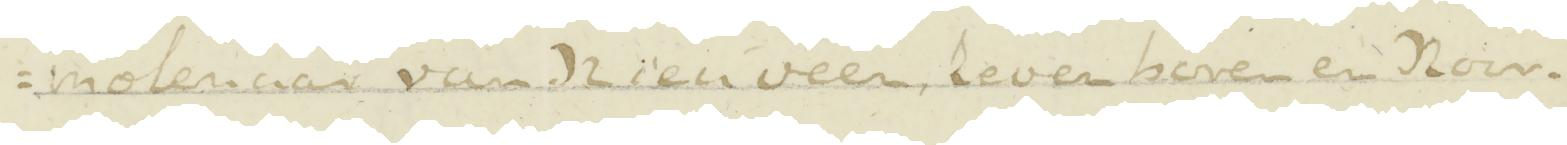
=molenaar van nieuveen, zevenhoven en noor-
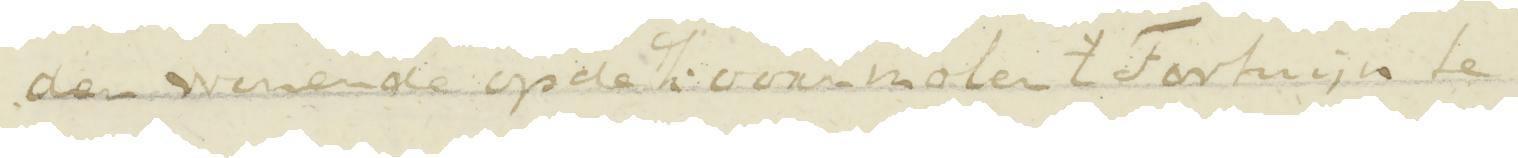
den wonende op de koorn-molen 't Fortuijn te
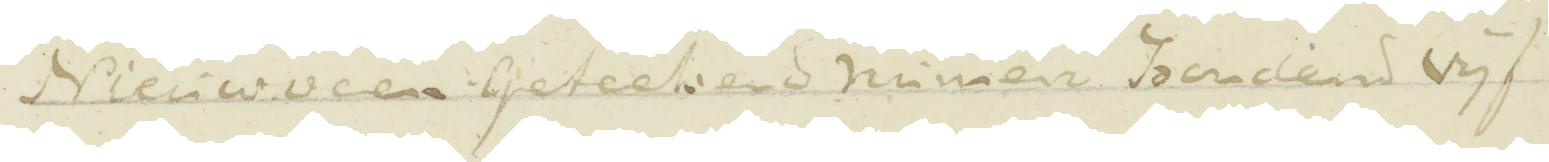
Nieuwveen. Geteekend numero honderd vijf
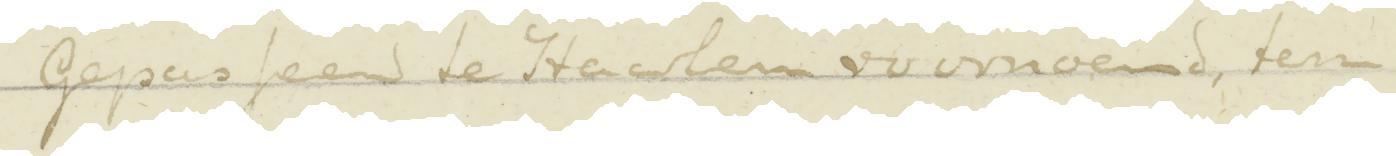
Gepasseerd te Haarlem voornoemd, ten
